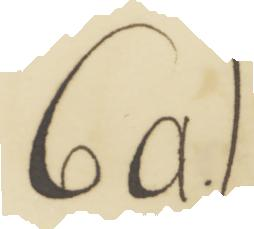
64.
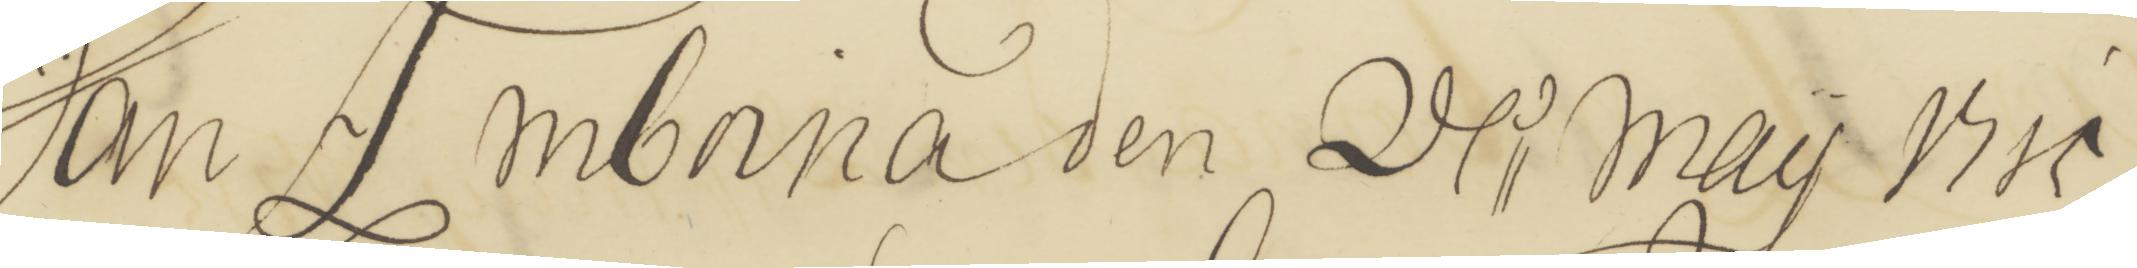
Van Amboina den 27„e Maij 1715.
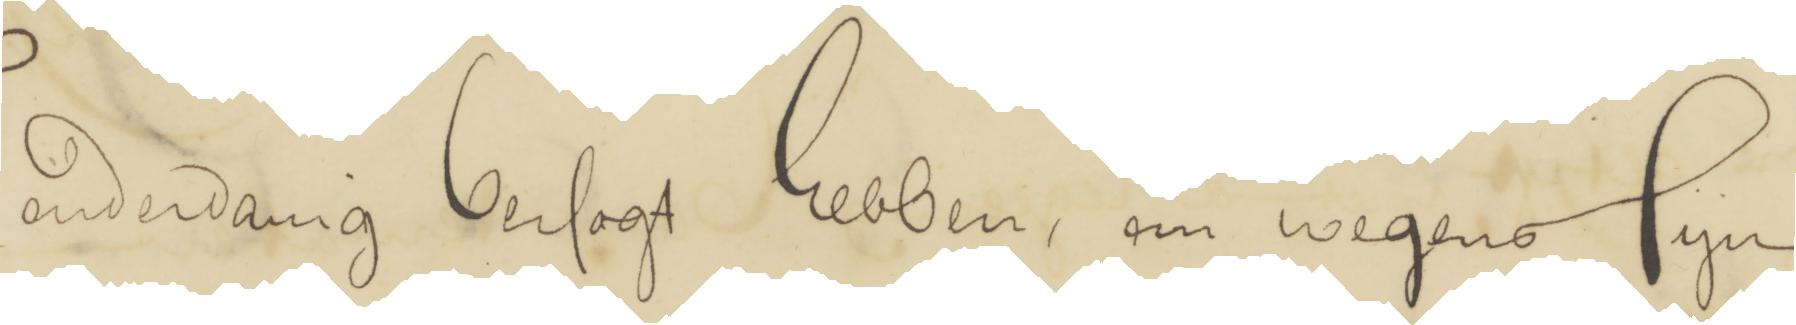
onderdanig versogt hebben, om wegens sijn
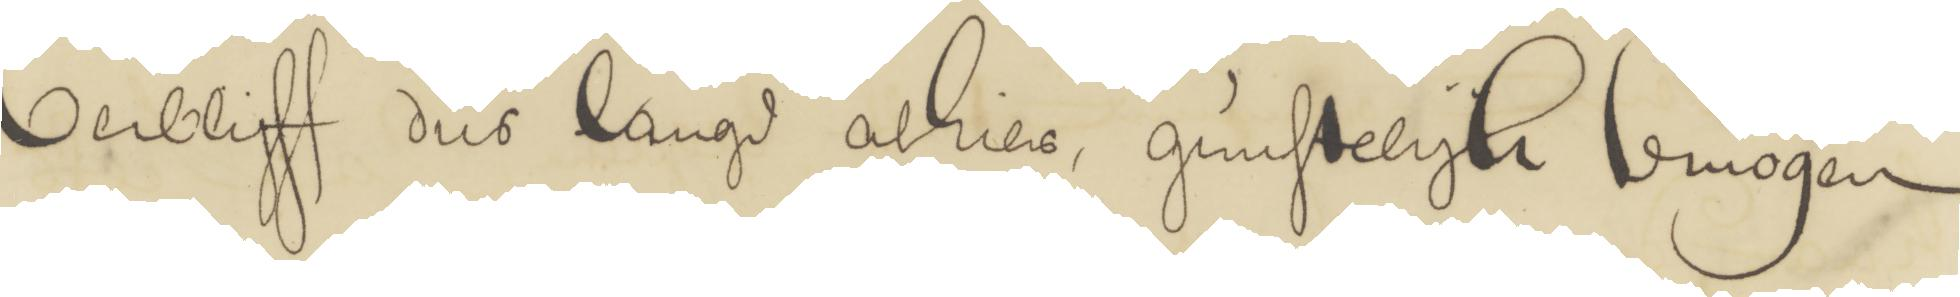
verblijff dus lange alhier, gunstelijk temogen
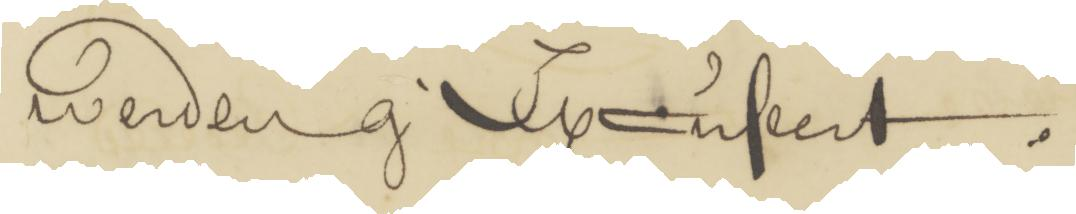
werden g’Excuseert.
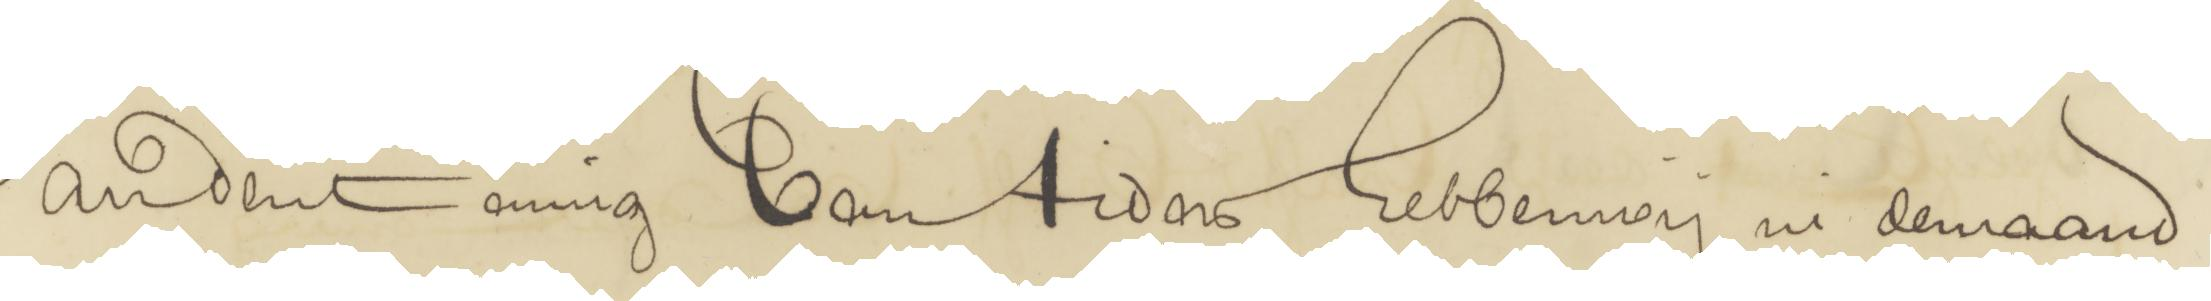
Vanden Coning Van tidor hebben wij in demaand
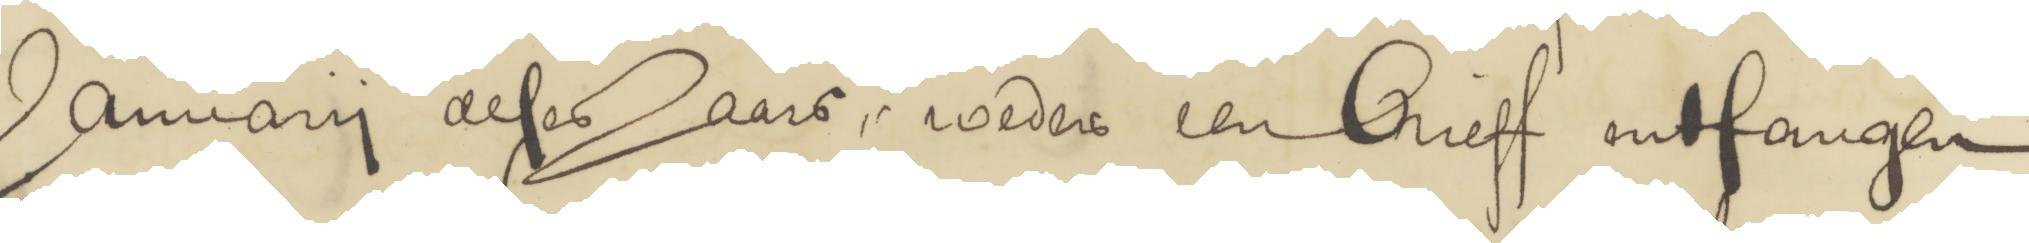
Januarij deses Jaars, weder een brieff ontfangen
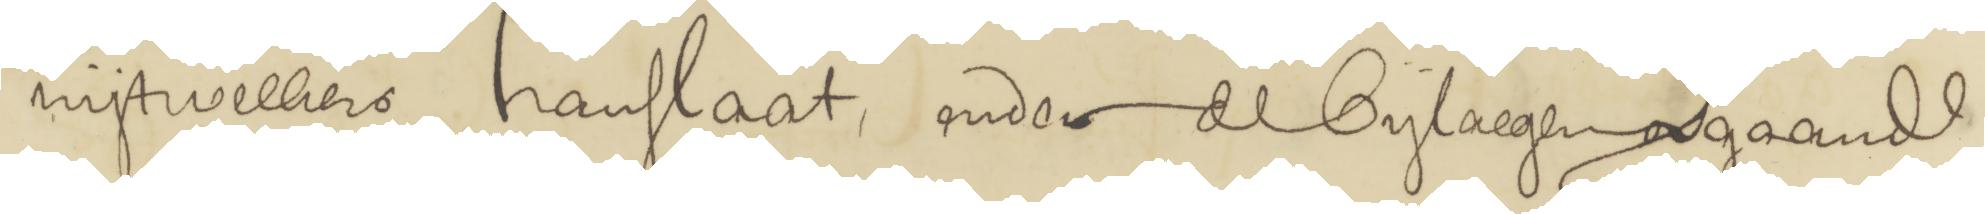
uijtwelkers translaat, onder de bijlaegen overgaande
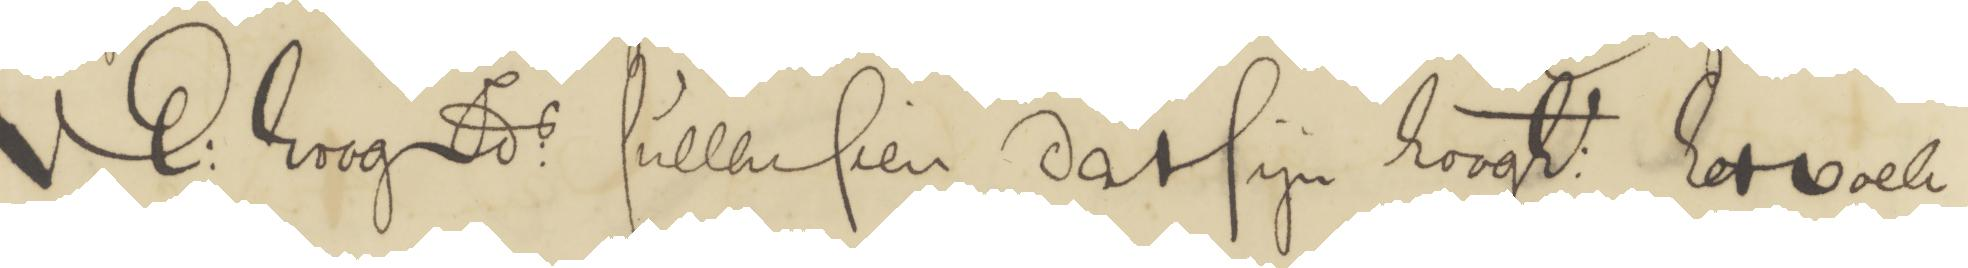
VE: hoog Ed:s sullen sien dat sijn hoogh:t het volk
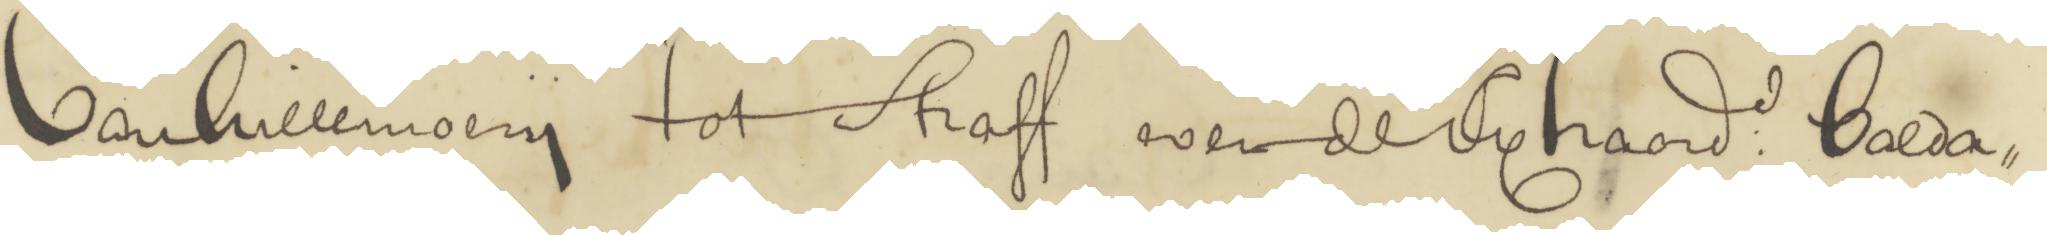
Van hillemoerij tot straff over de Extraord:e balda„
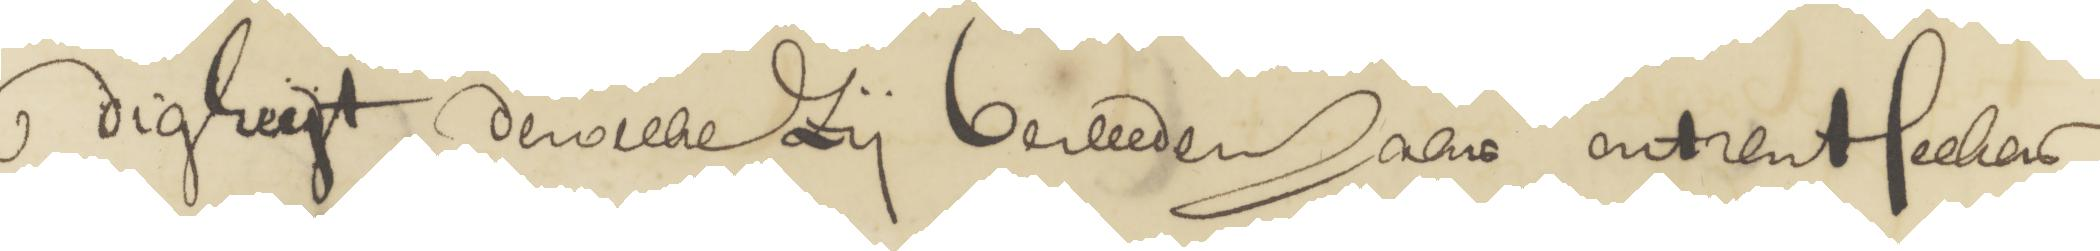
digheijt dewelke zij verleeden Jaar ontrent seeker
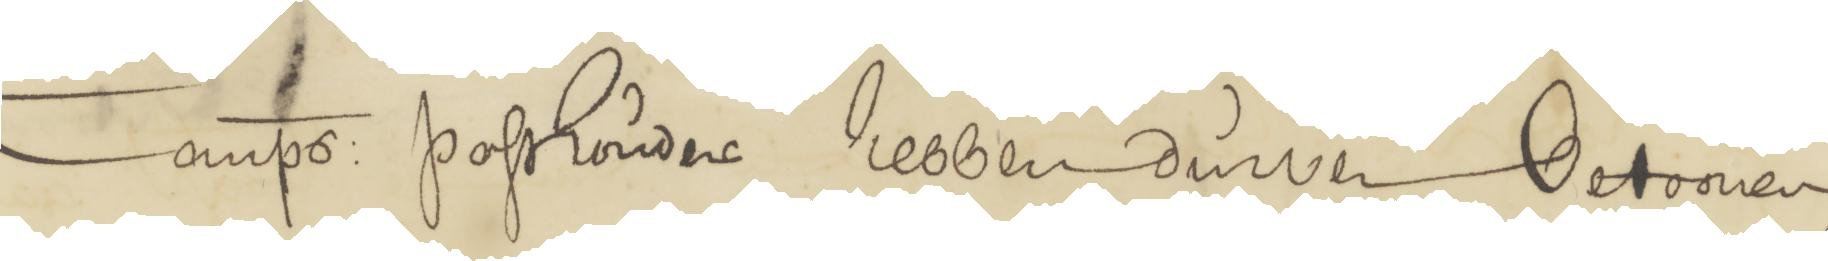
Comps: posthouder hebben duwer betoonen
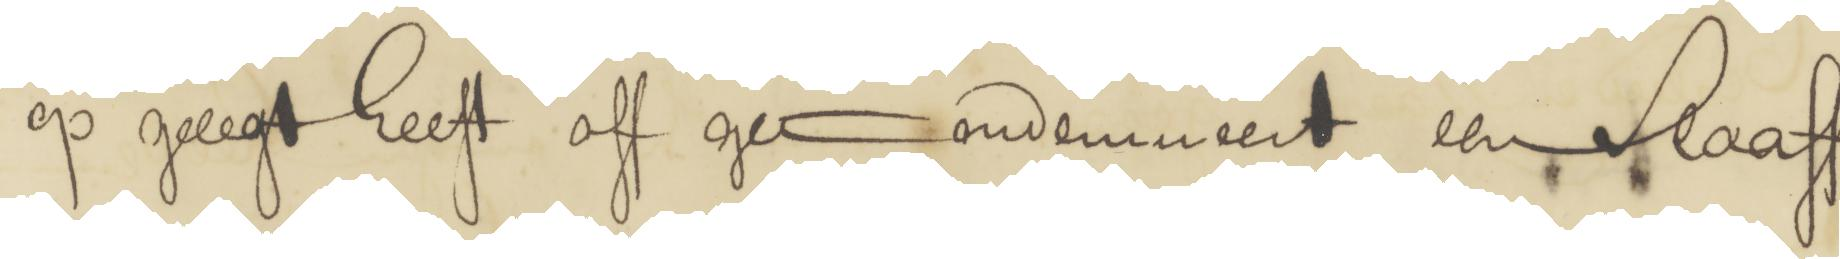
op gelegt heeft off gecondemneert een slaaff
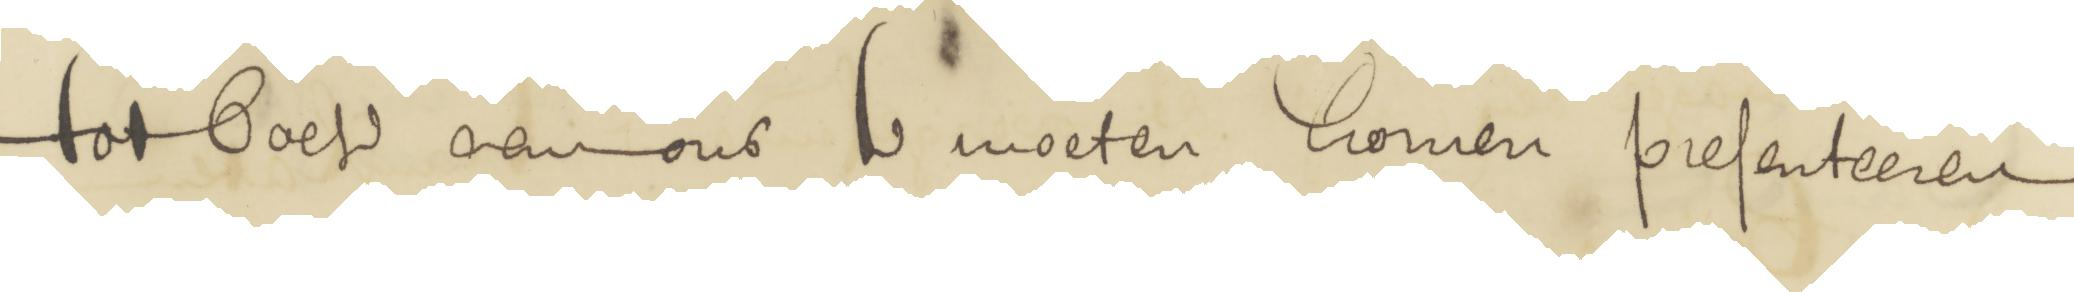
tot boete aan ons te moeten komen presenteeren
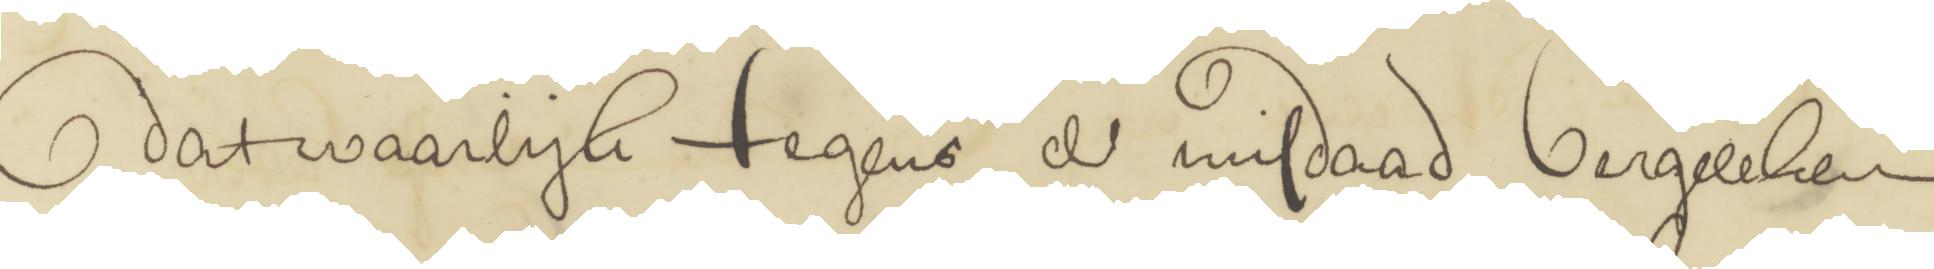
dat waarlijk tegens de misdaad vergeleken
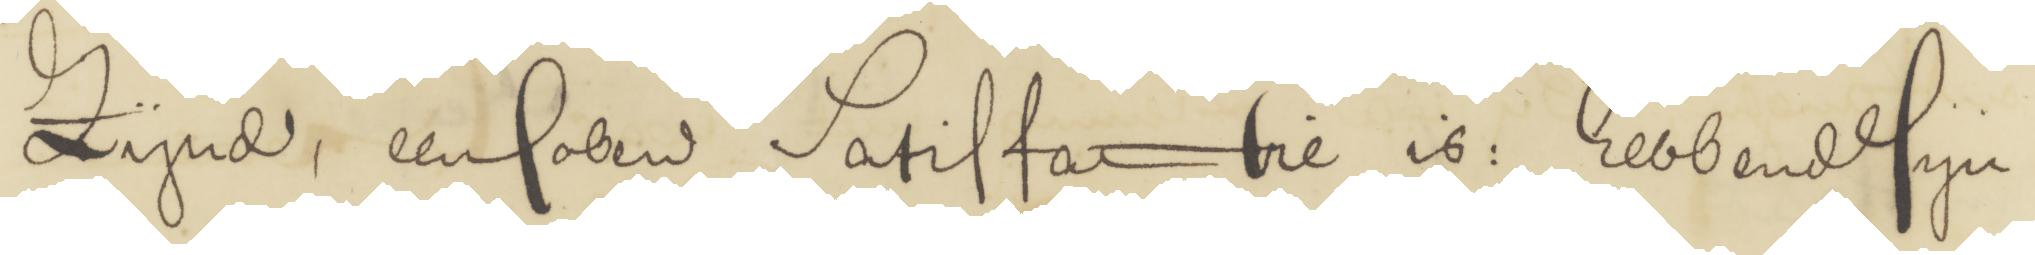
Zijnde, eens obere satisfactie is: hebbende sijn
